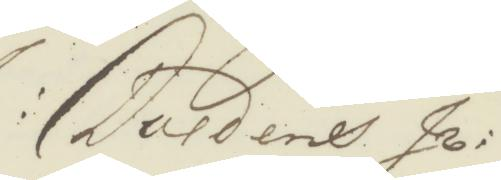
J: Doedens Jr:
